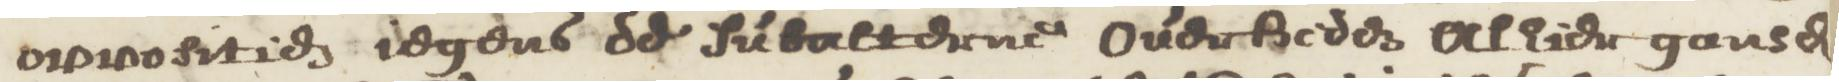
oppositien iegens de subalterne ouerheden alhier gansch
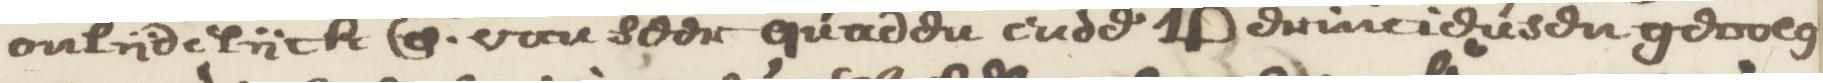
onlijdelijck ende van seer quaden ende Pernicieusen gevolg
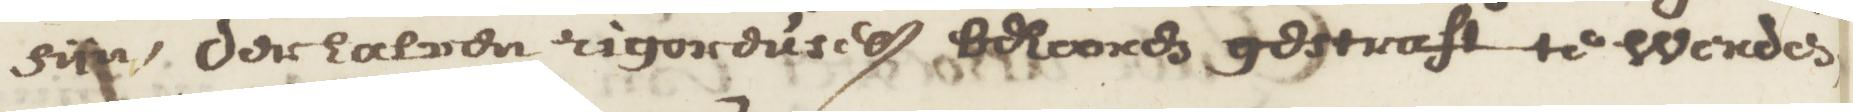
sijn, derhalven rigoreuselijk behooren gestraft te werden
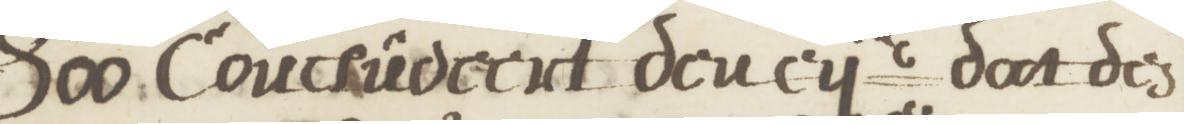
Soo concludeert den eij=r dat den
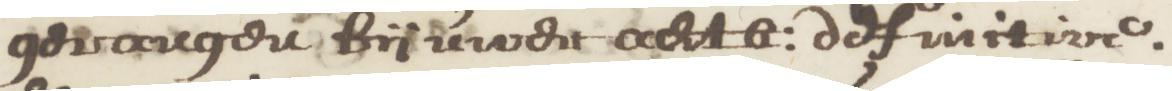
gevangen bij uwen achtb: definitive.
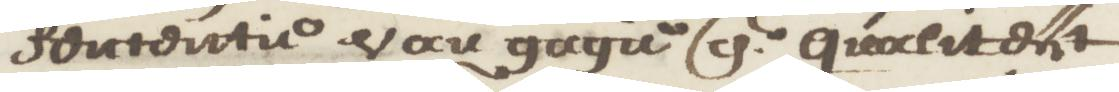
sententie van gagie ende qualiteijt
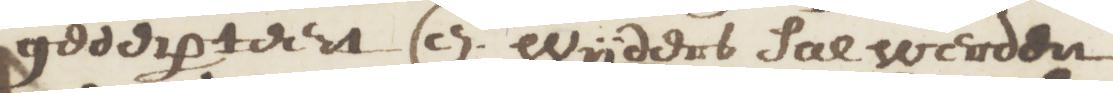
gedepteert ende wijders sal werden
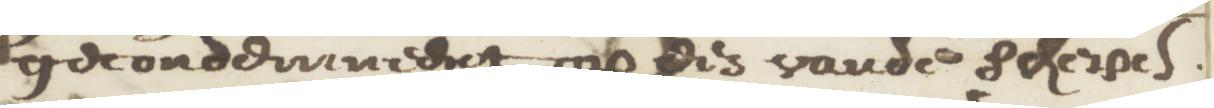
gecondemneert op des vande schepen.
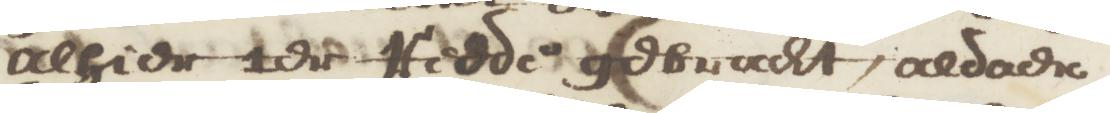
alhier ter reede gebracht, aldaer
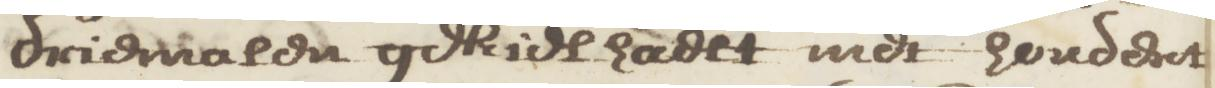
driemalen gekielhaelt met hondert
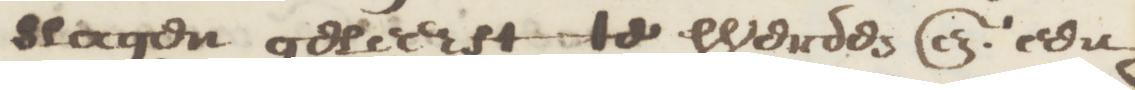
slagen geleerst te werden ende een
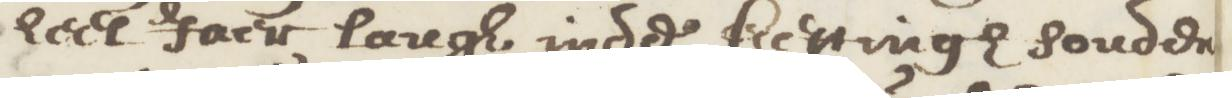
heel Iaer langh inde sichtingh sonder
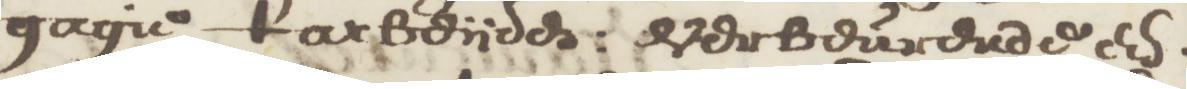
gagie t'arbeijden: verbeurende een
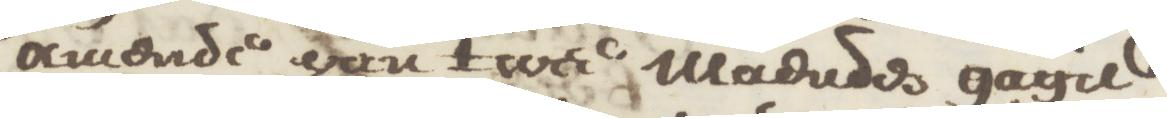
amende van twee maenden gagie
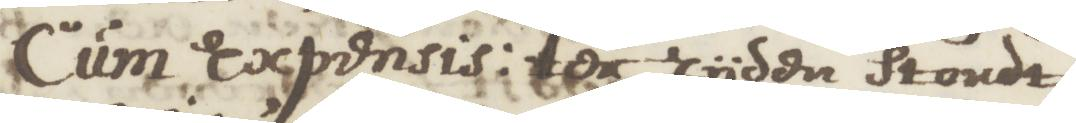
Cum Expensis; ter zijden stondt
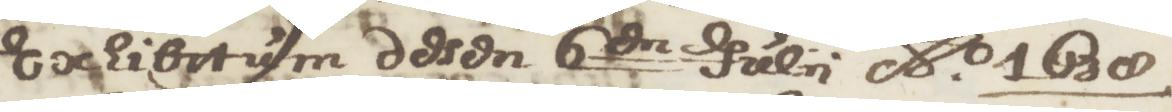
Exhibitum desen 6=en Iulij A=o 1638
